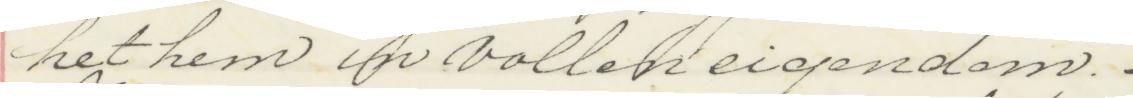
het hem in vollen eigendom.
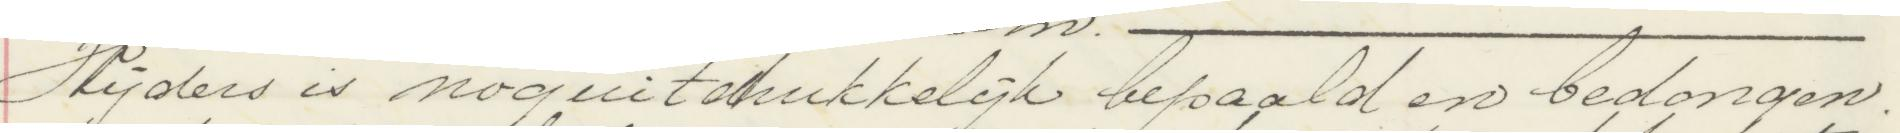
Wijders is nog uitdrukkelijk bepaald en bedongen.
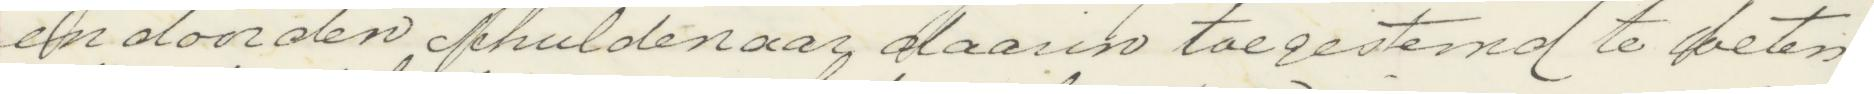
en door den schuldenaar daarin toegestemd te weten:
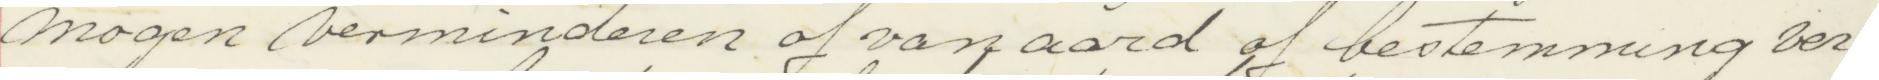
mogen verminderen of van aard of bestemming ver.
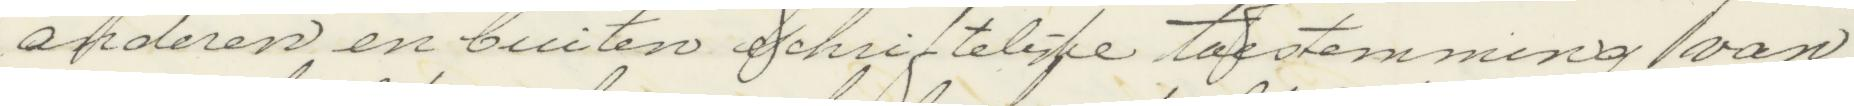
anderen en buiten schrifteljke toestemming van
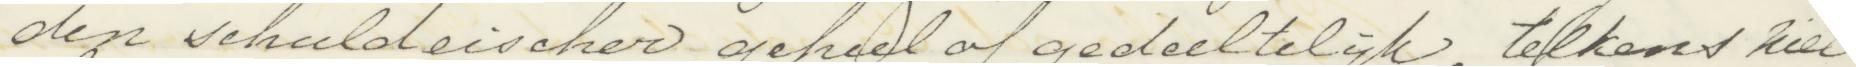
den schuldeischer geheel of gedeeltelijk telkens niet
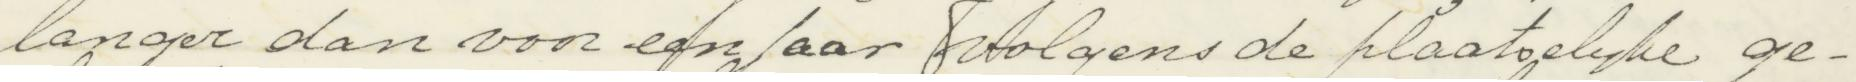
langer dan voor een jaar volgens de plaatselyke ge-
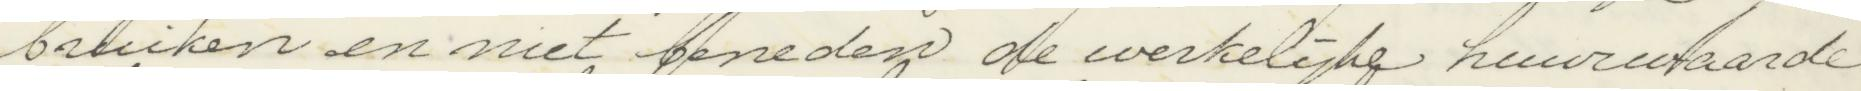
bruiken en niet beneden de werkelijke huurwaarde
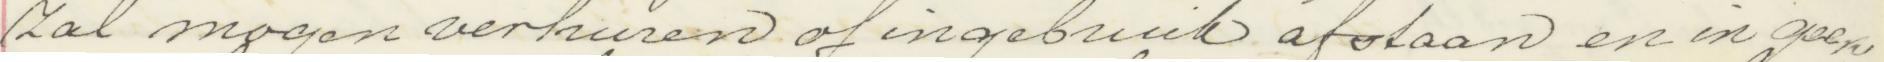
zal mogen verhuren of ingebruik afstaan en in geen
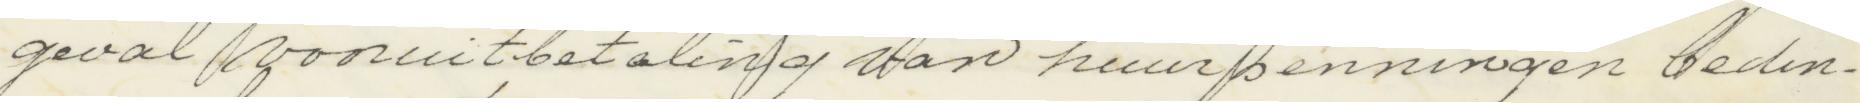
geval vooruitbetaling van huurpenningen bedin
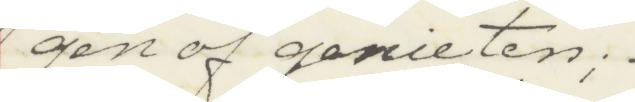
gen of genieten;
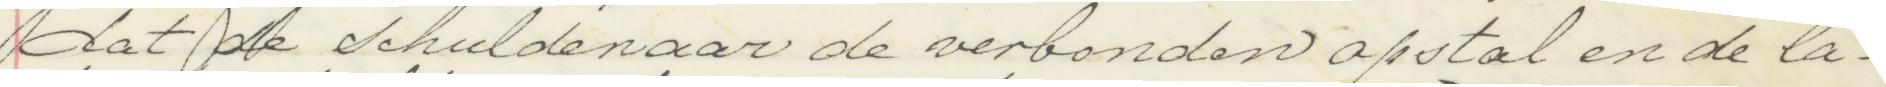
dat de schuldenaar de verbonden opstal en de la-
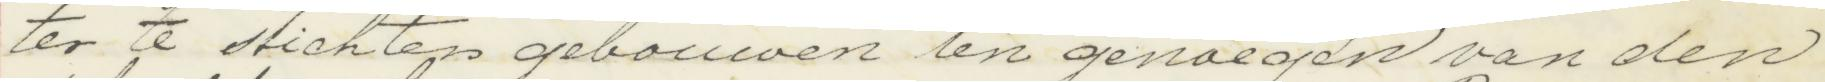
ter te stichten gebouwen ten genoegen van den
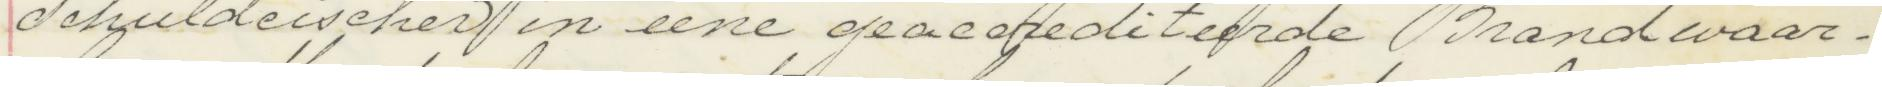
Schuldeischer in eene geaccrediteerde Brandwaar-
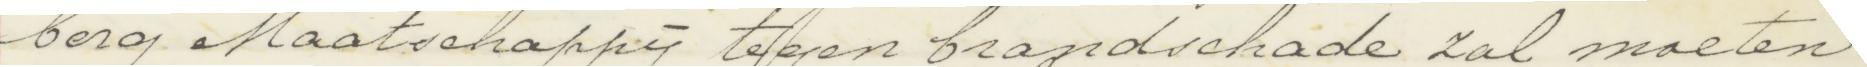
borg Maatschappij tegen brandschade zal moeten
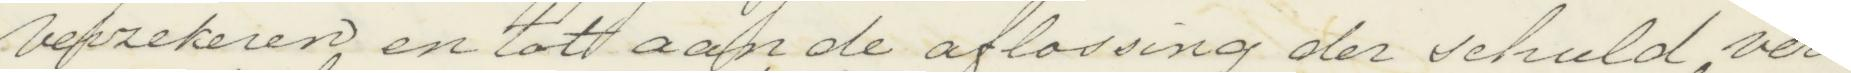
verzekeren, en tot aan de aflossing der schuld ver-
